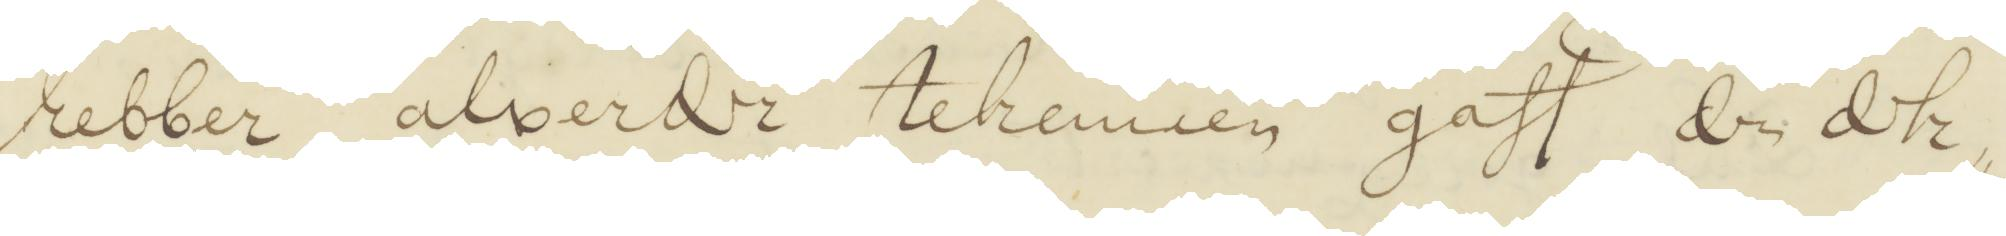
hebber alverder tekennen gaff den dek„
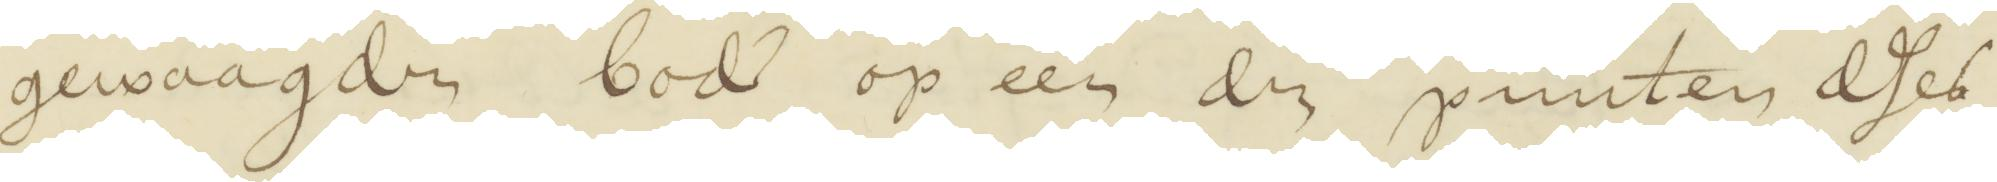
gewaagden bode op een den punten deses
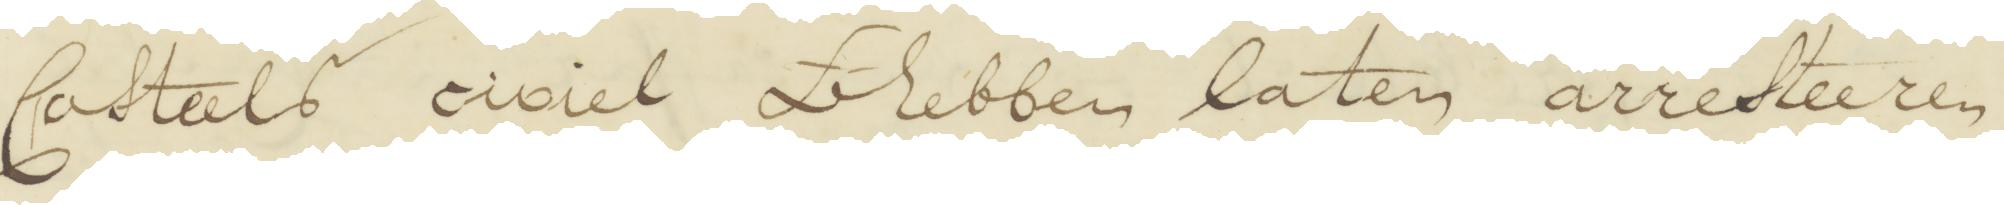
Casteels civiel te hebben laten arresteeren
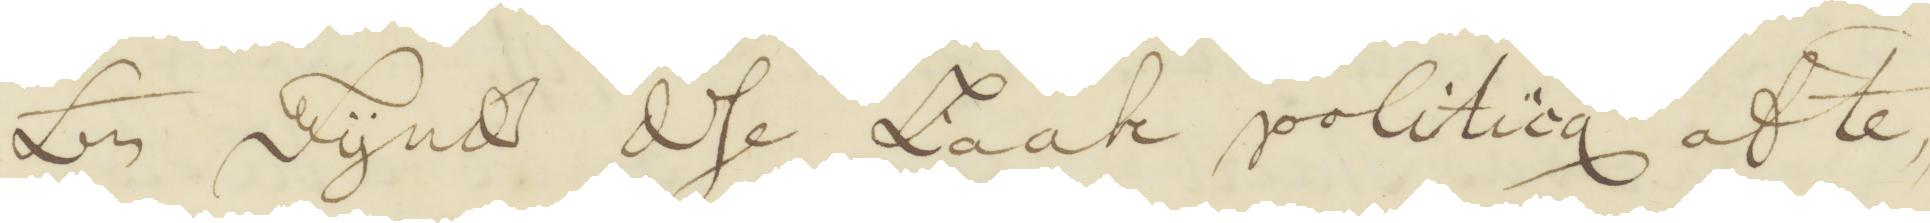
ten Eijnde dese zaak politicq af te„
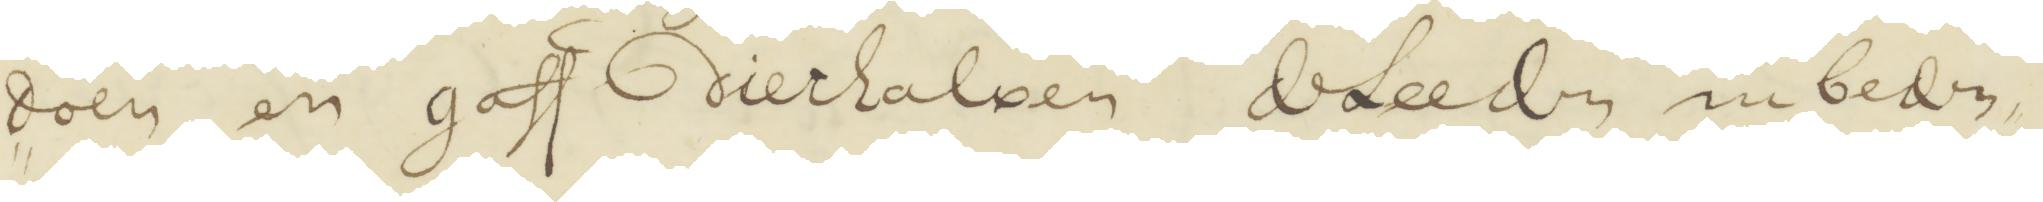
„doen en gaff dierhalven de leeden in beden„
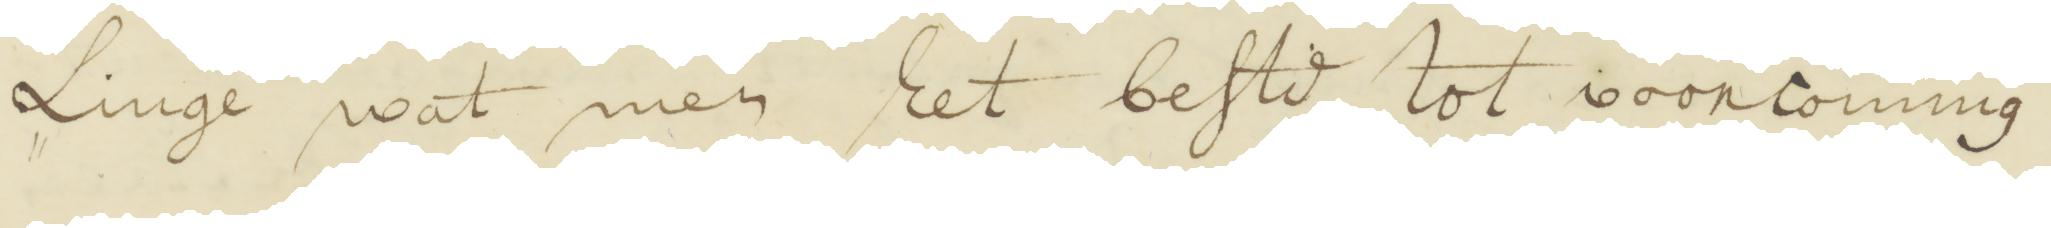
„Linge wat men het beste tot voorcoming
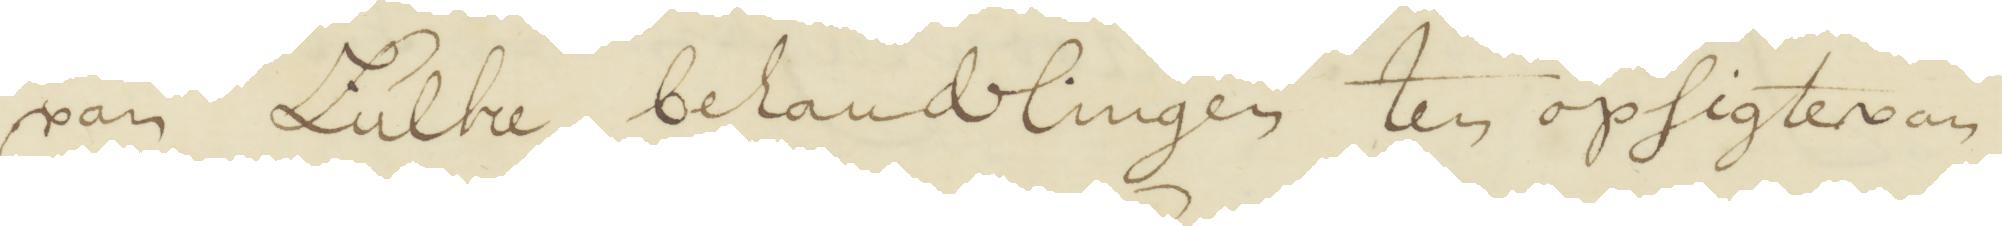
van zulke behandelingen ten opsigte van
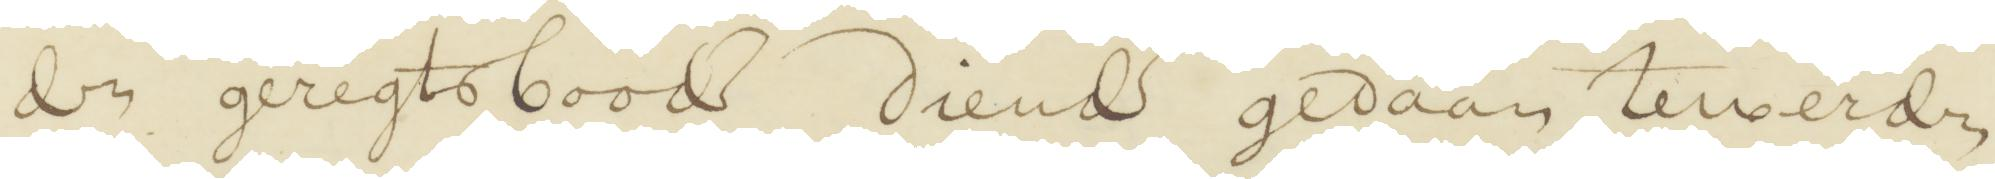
den geregtsboode diende gedaan tewerden
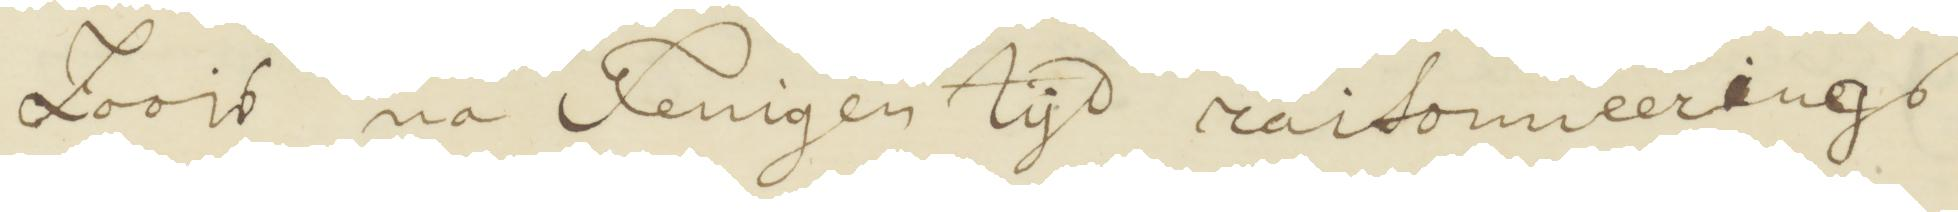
zoo is na Eenigen tijd raisonneerings
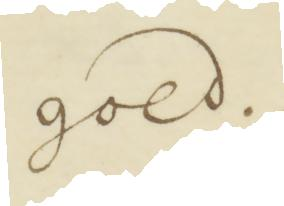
goed.
